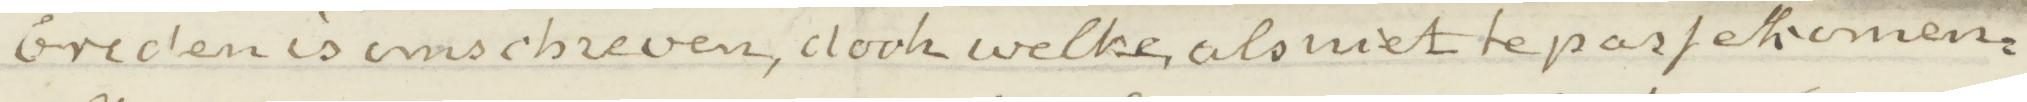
breden is omschreven, doch welke als niet te passekomen=
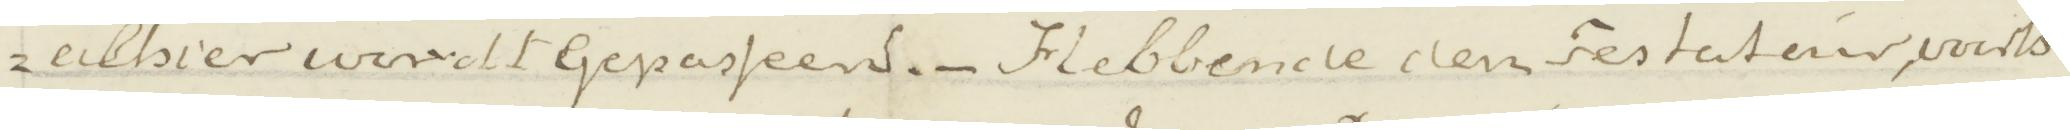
=alhier wordt Gepasseerd. – Hebbende den Testateur, voorts
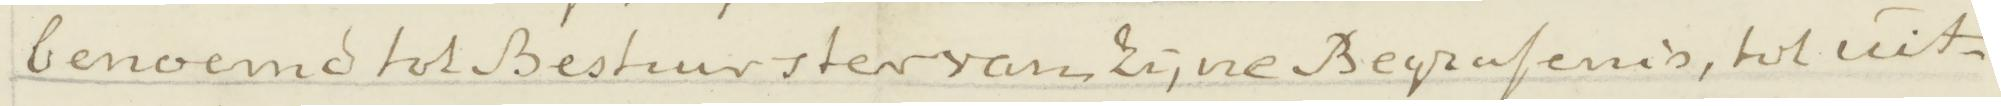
benoemd tot Bestuurster van zijne Begrafenis, tot uit=
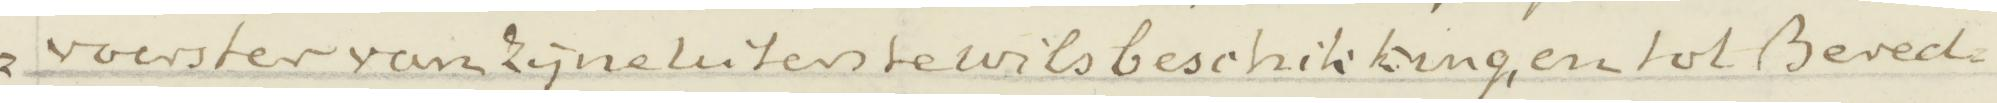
=voerster van zijne uiterste wilsbeschikking, en tot Bered=
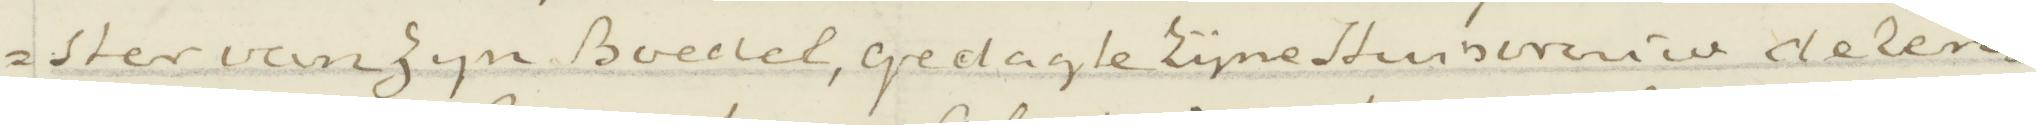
=ster van zyn Boedel, gedagte zijne Huisvrouw de ren=
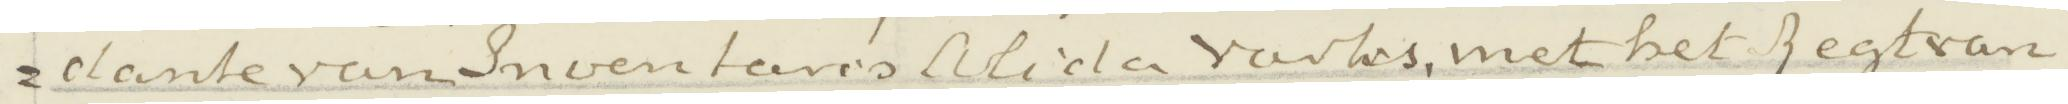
=dante van Inventaris Alida Varks, met het Regt van
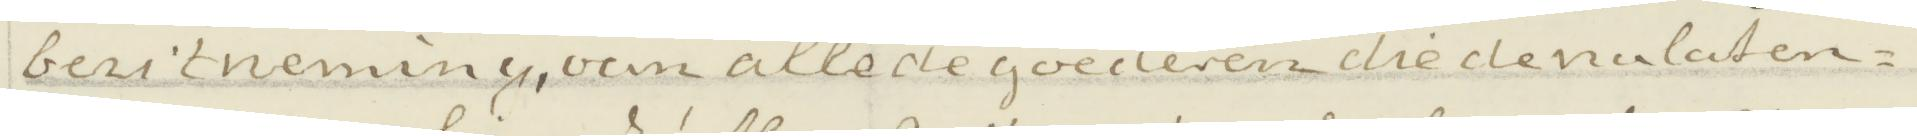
bezitneming, van alle de goederen die de nalaten=
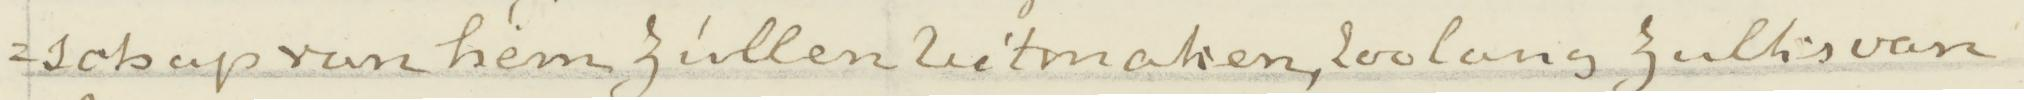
=schap van hem zullen uitmaken, zoolang zulks van
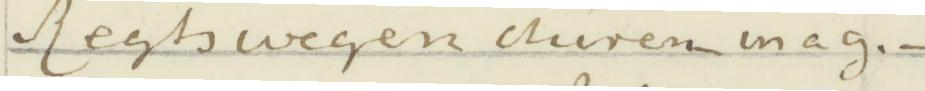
Regtswegen duren mag.
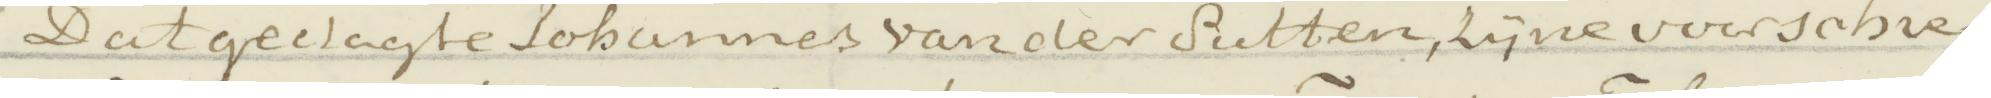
Dat gedagte Iohannes van der Putten, zijne voorschre=
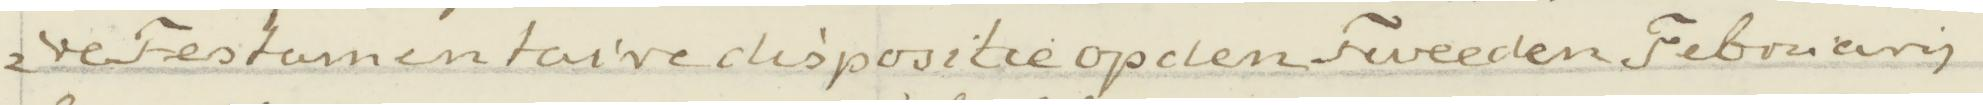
=ve Testamentaire dispositie op den Tweeden Februarij
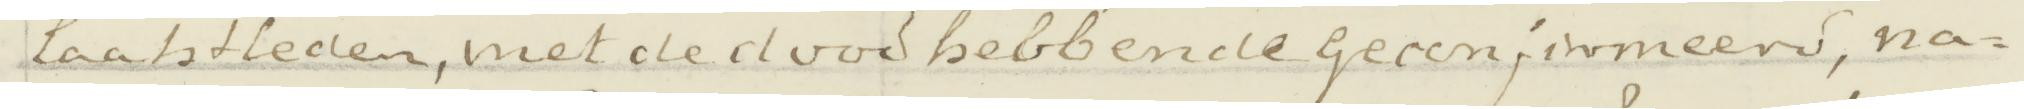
laatstleden, met de dood hebbende geconfirmeerd, na=
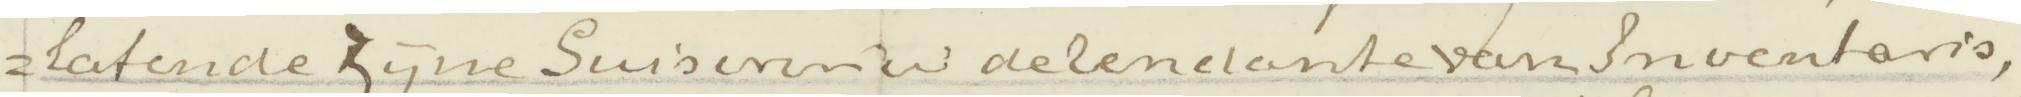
=latende Zijne huisvrouw de rendante van Inventaris,
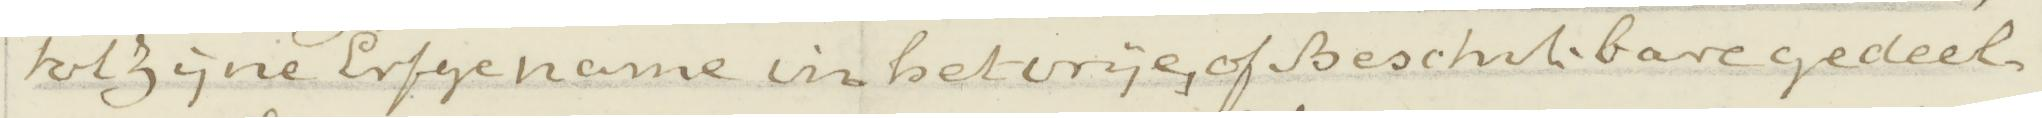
tot zijne Erfgename in het vrije of Beschikbare gedeel=
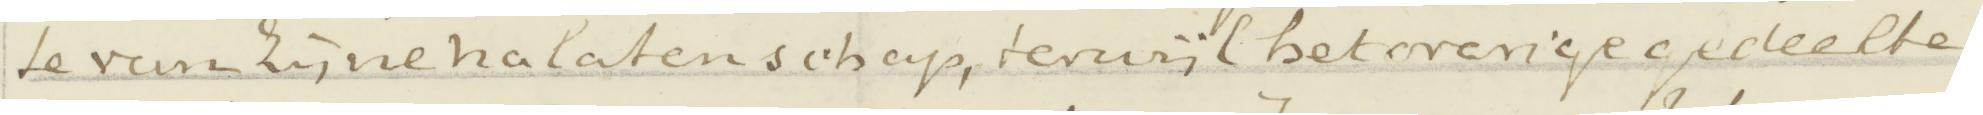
te van zijne nalatenschap, terwijl het overige gedeelte
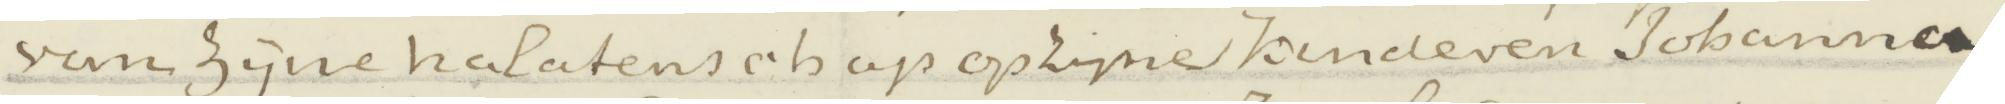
van zijne nalatenschap op zijne kinderen Iohanna
